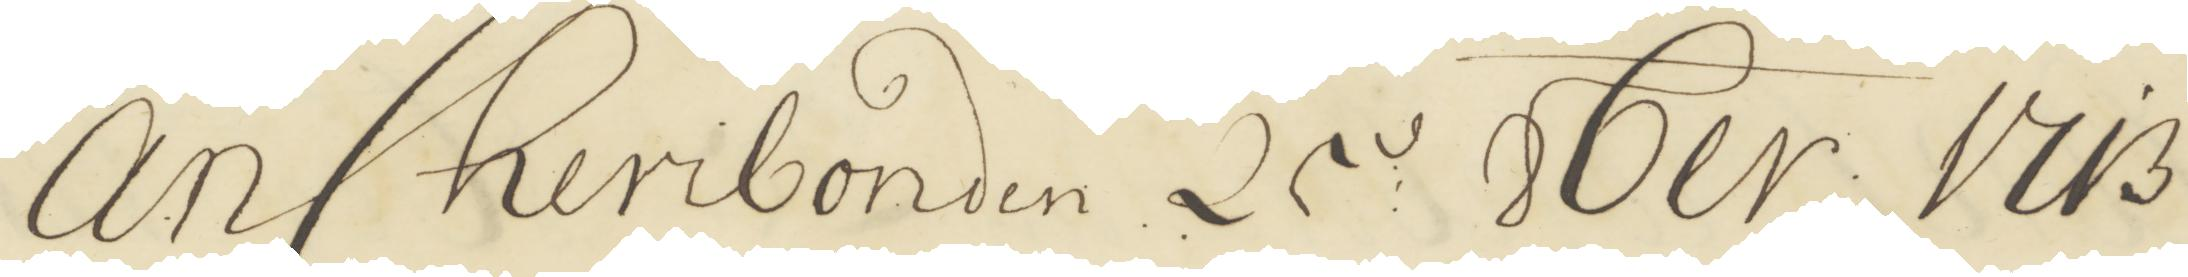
Van Cheribon den 25:e 8ber: 1713
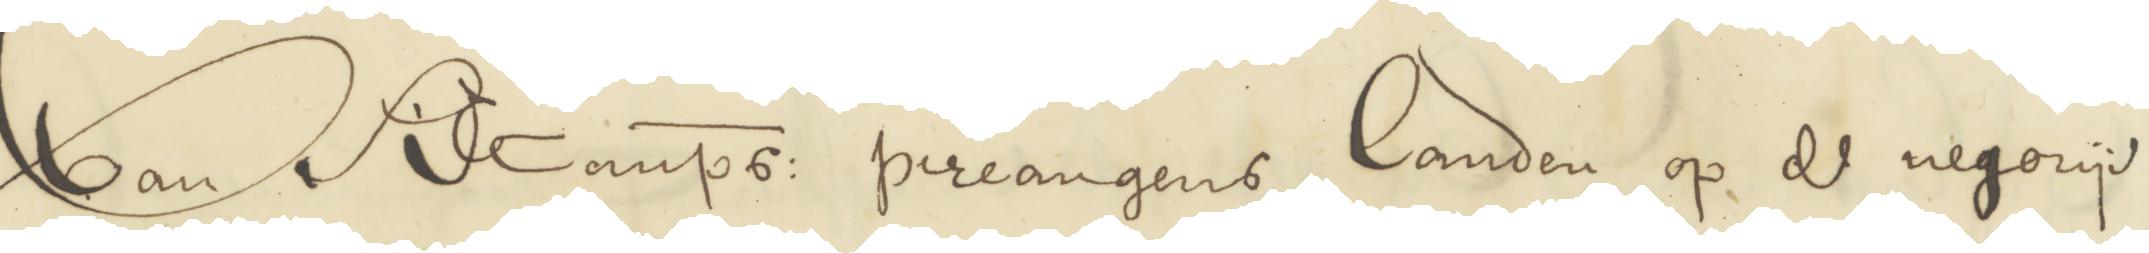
van S' Ecomps: preangens landen op de negorije
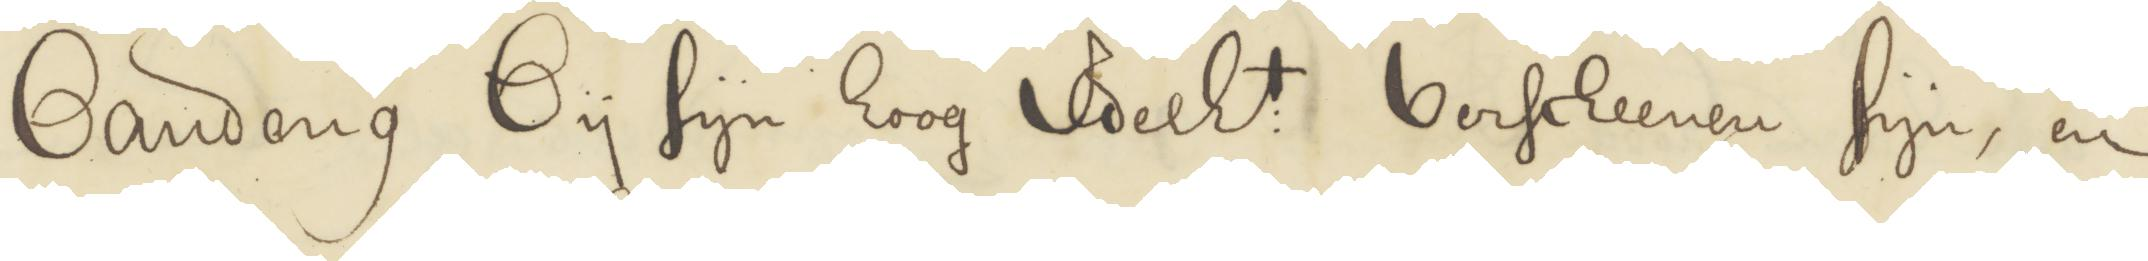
bandong bij sijn hoog Edelh:t verscheenen sijn, en
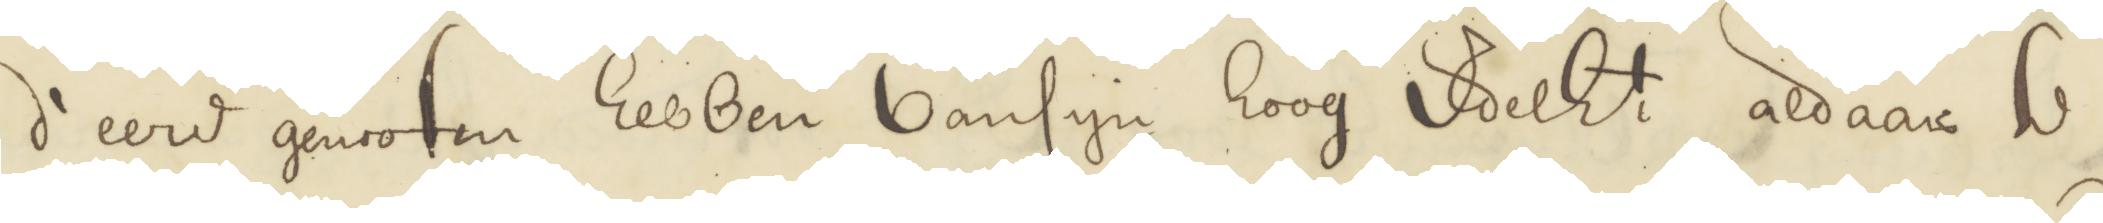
d’ eere genooten hebben van sijn hoog Edelh:t aldaar te
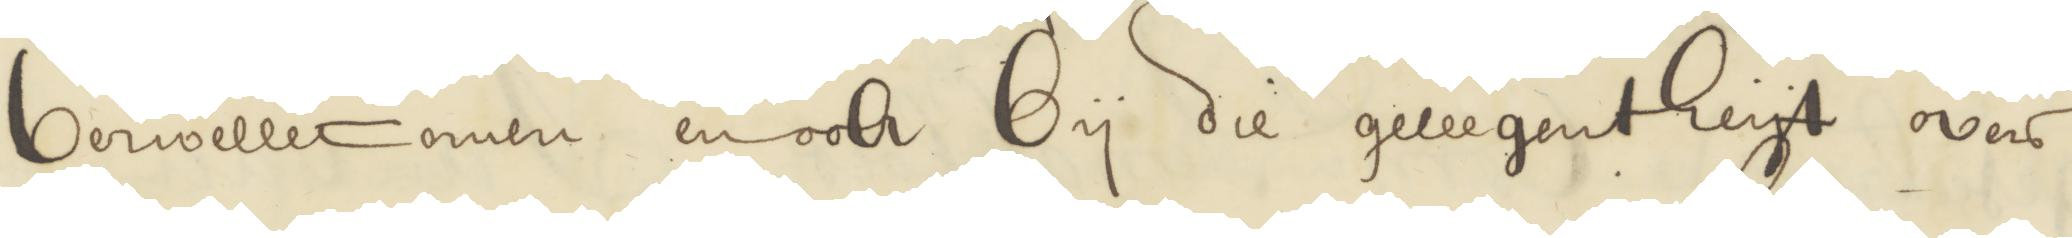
verwellecomen en ook bij die geleegentheijt overs
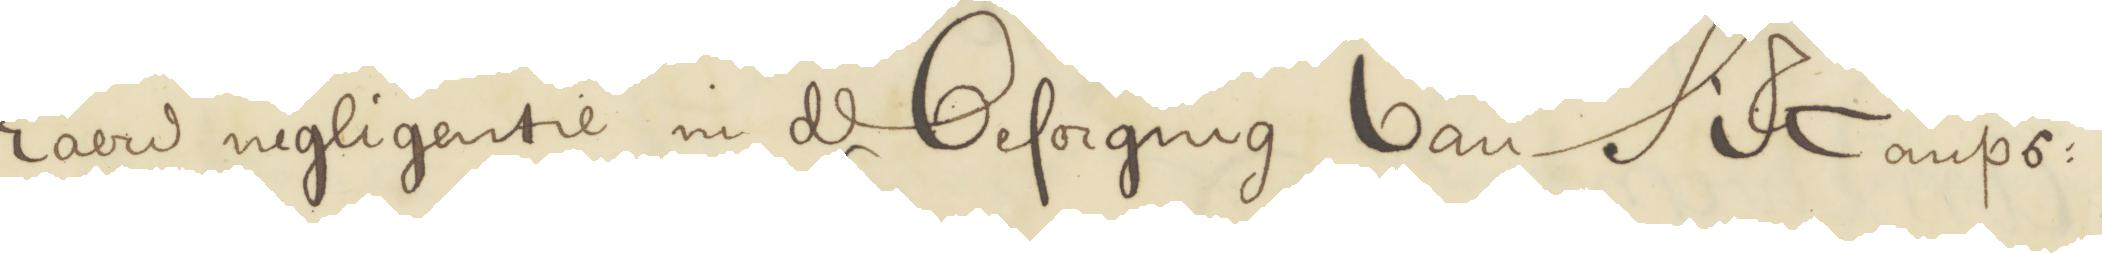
haere negligentie in de besorging van s' EComps:
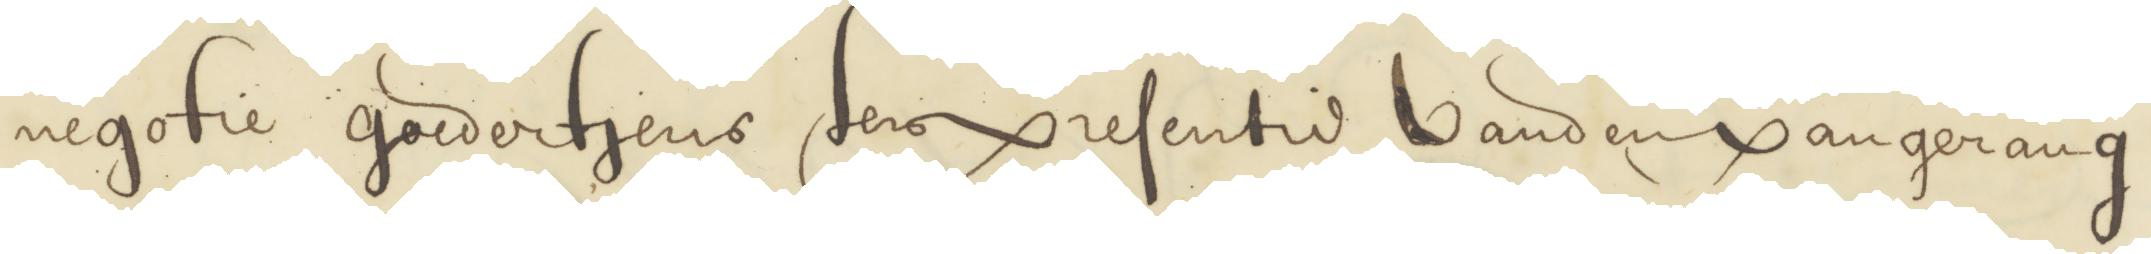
negotie goedertjens ter presentie vanden pangerang
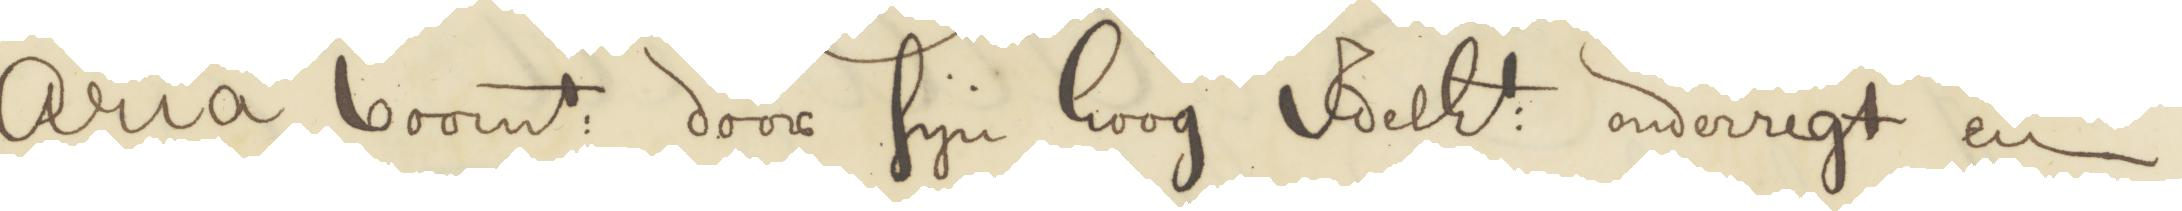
Aria voorn:t door sijn hoog Edelh:t onderregt en
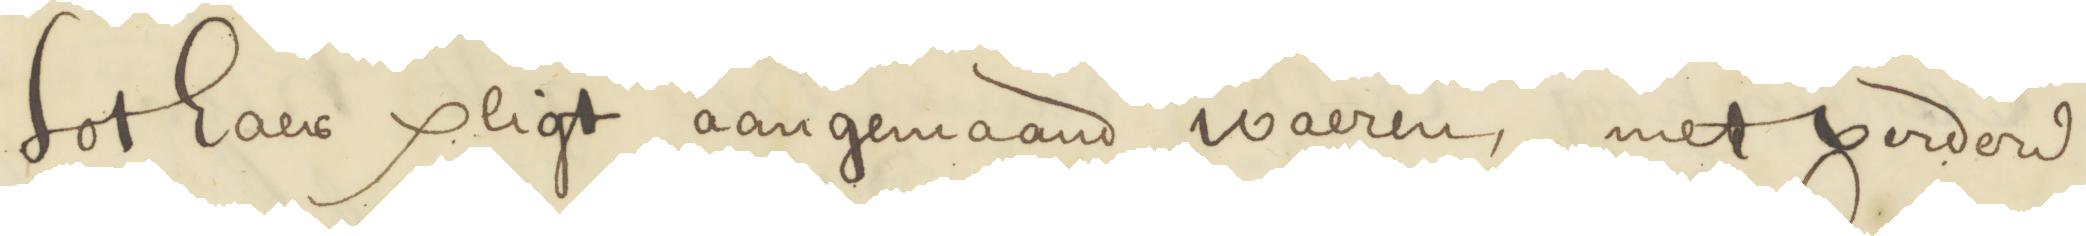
tot haer pligt aangemaand waeren, met verdere
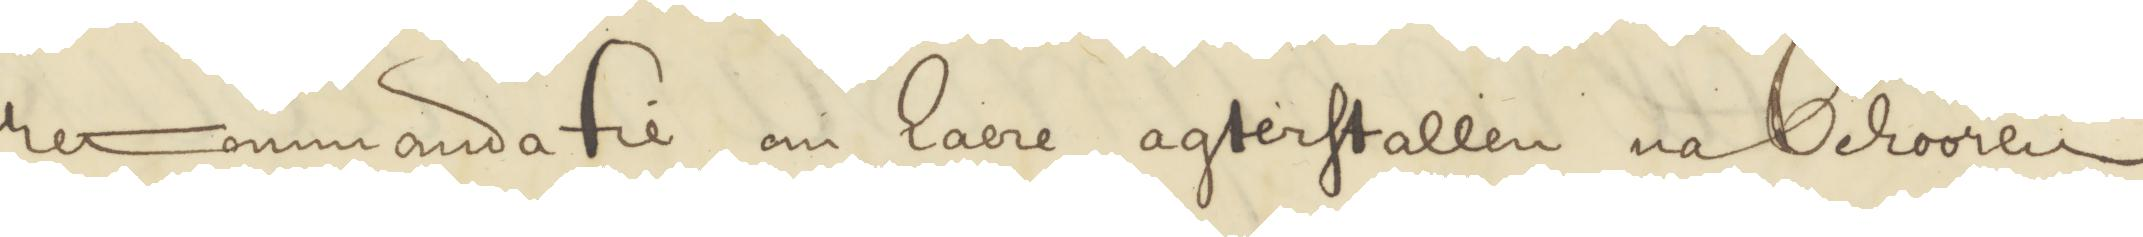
recommandatie om haere agterstallen na behooren
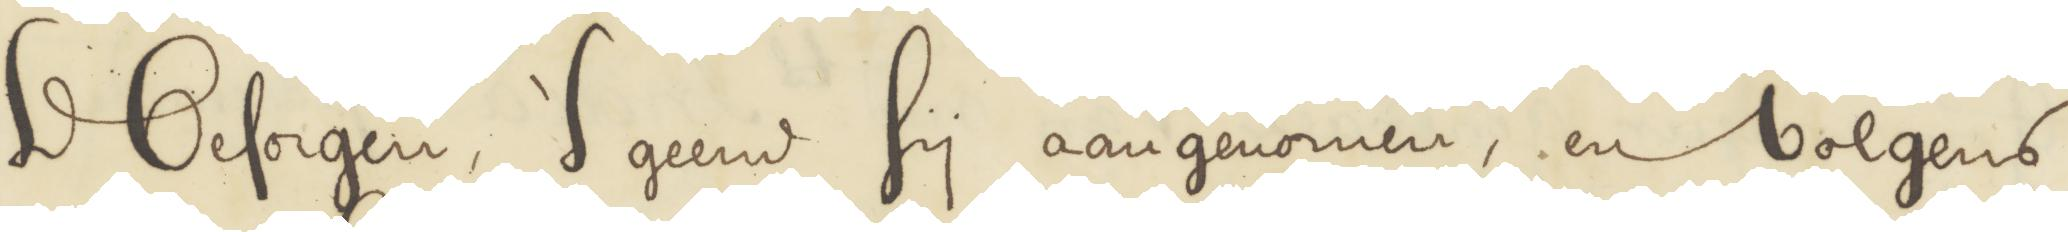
te besorgen, 't geene sij aangenomen, en volgens
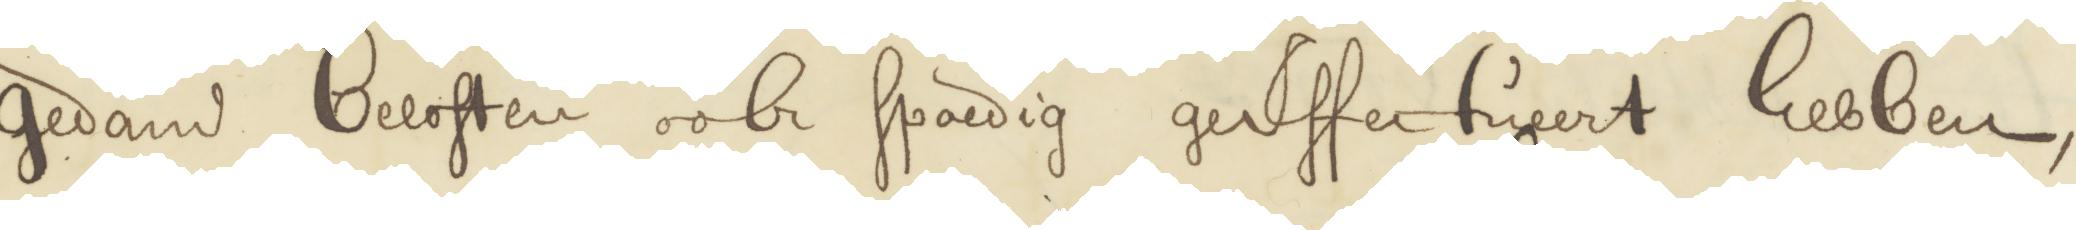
gedane beloften ook spoedig geeffectueert hebben,
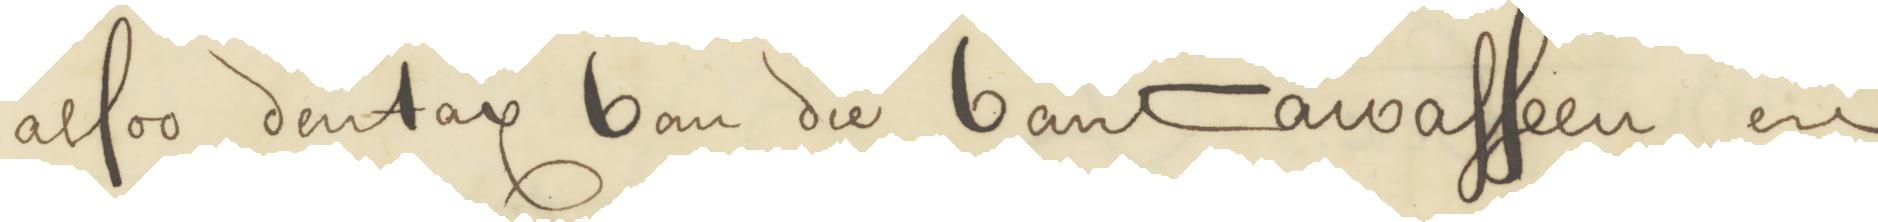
alsoo den tax van die van cawasseen en
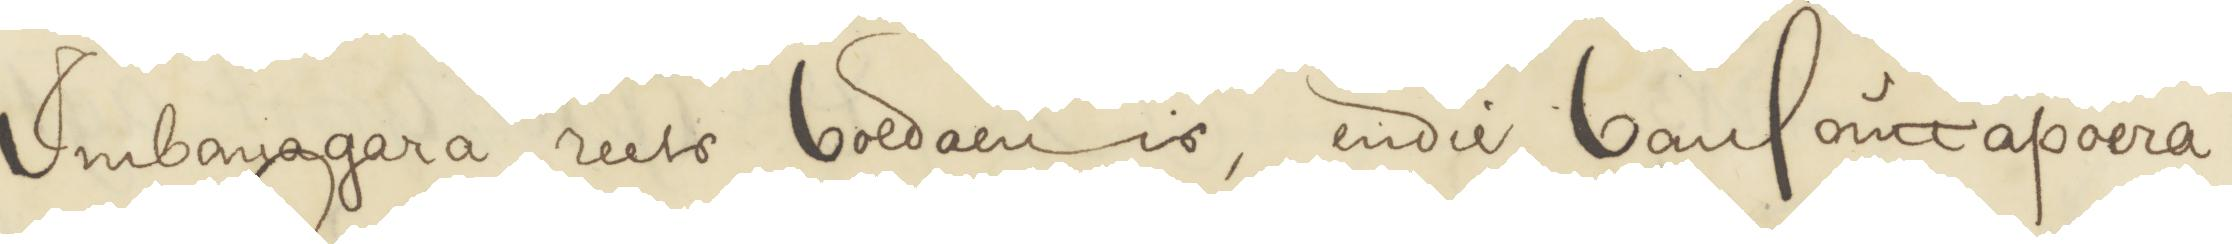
Embaragara reets voldaen is, endie van souccapoera
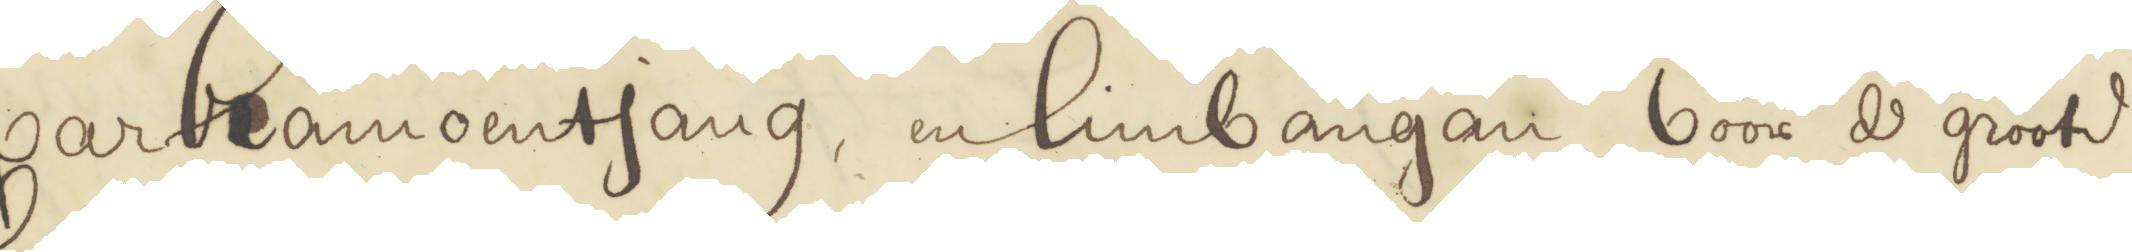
parkamoentjang, en limbangan voor de groote
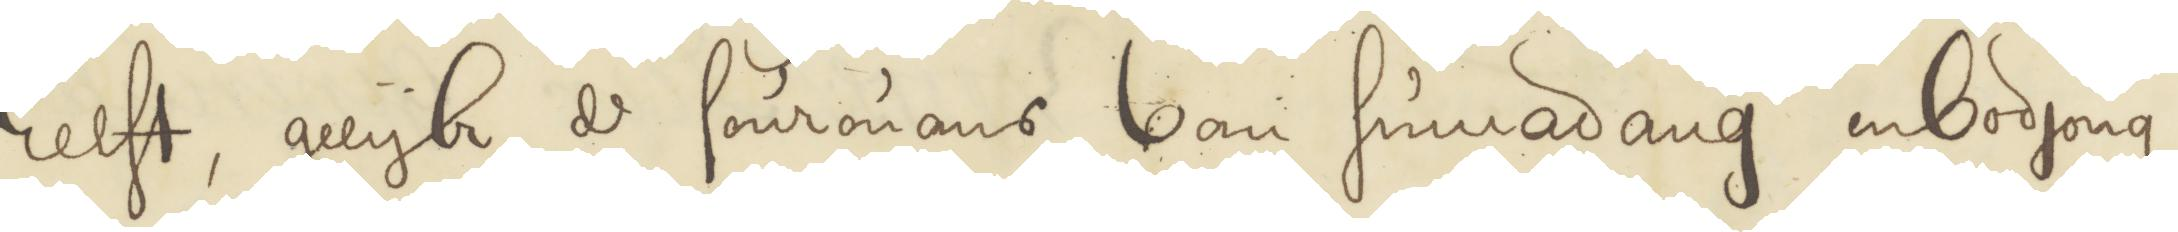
helft, gelijk de sourouans van sumadang en bodjong
